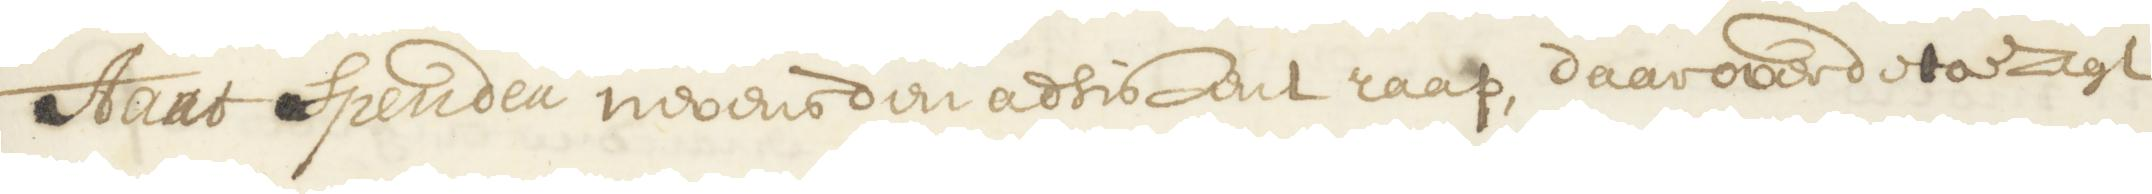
Hans Spender nevens den adsistent raap, daarover de toezigt
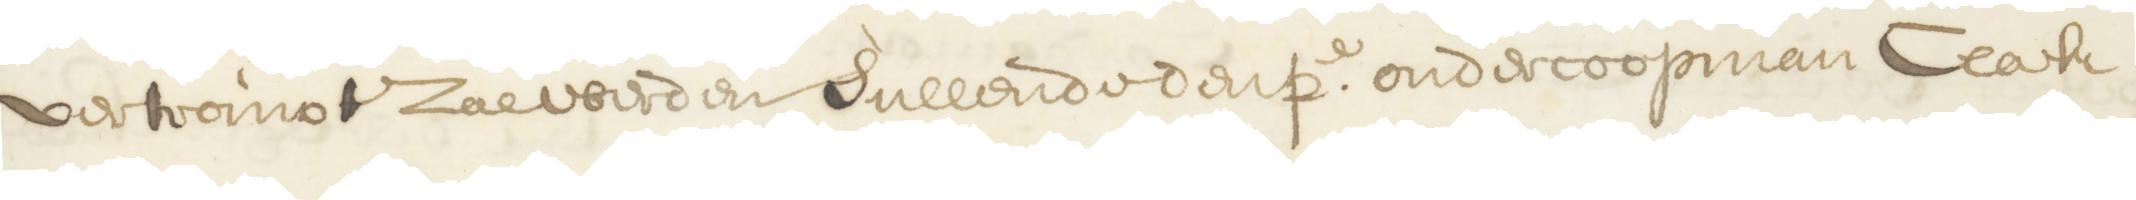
vertrouwt zal werden sullende den p.l ondercoopman Cloek
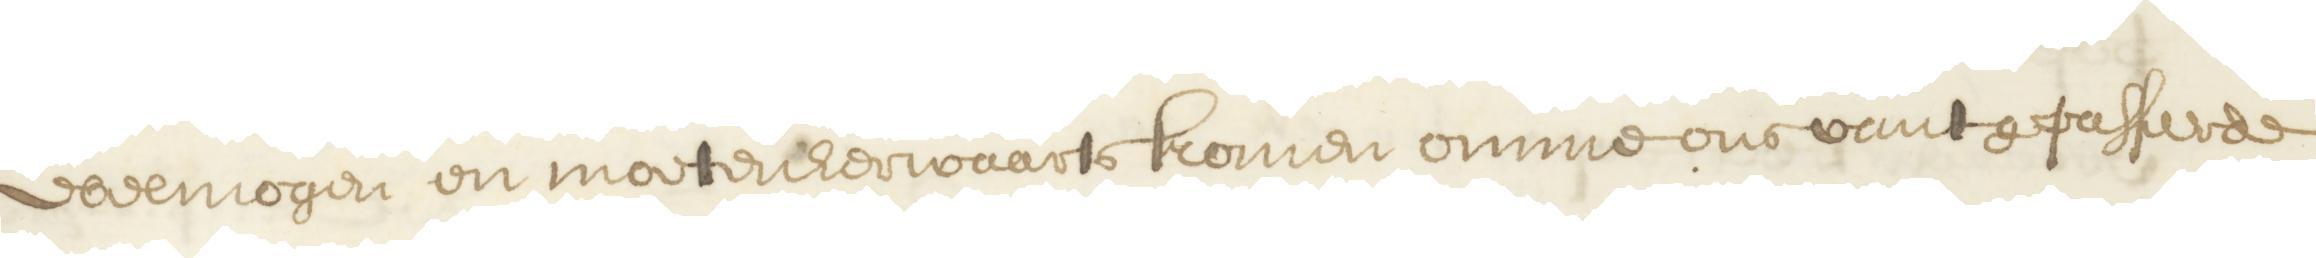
welmogen en moetenherwaarts komen omme ons vant gepasseerde
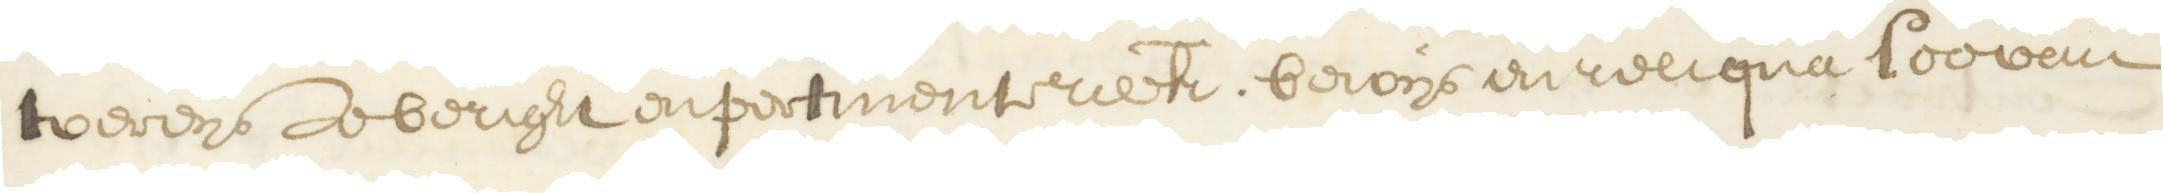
tvereijste beright en pertinente reek. bewijs en reliqua soo van
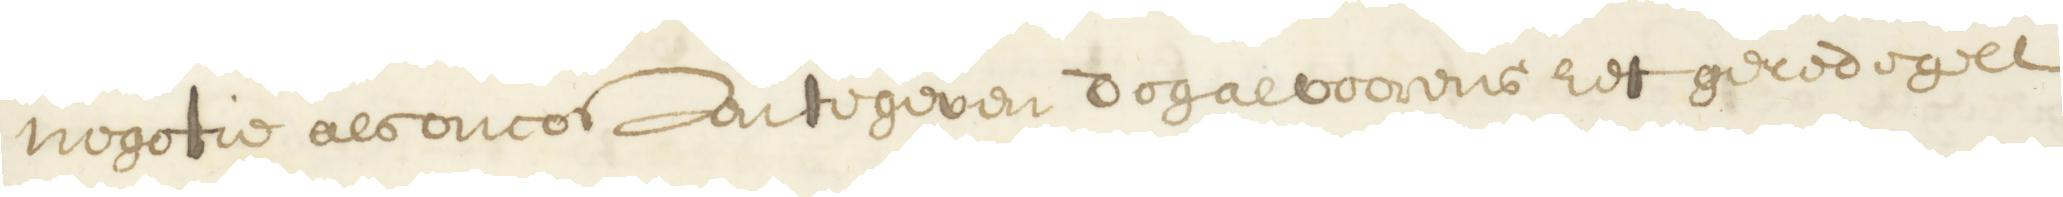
negotie als oncosten te geven dog alvoorens het geredegelt
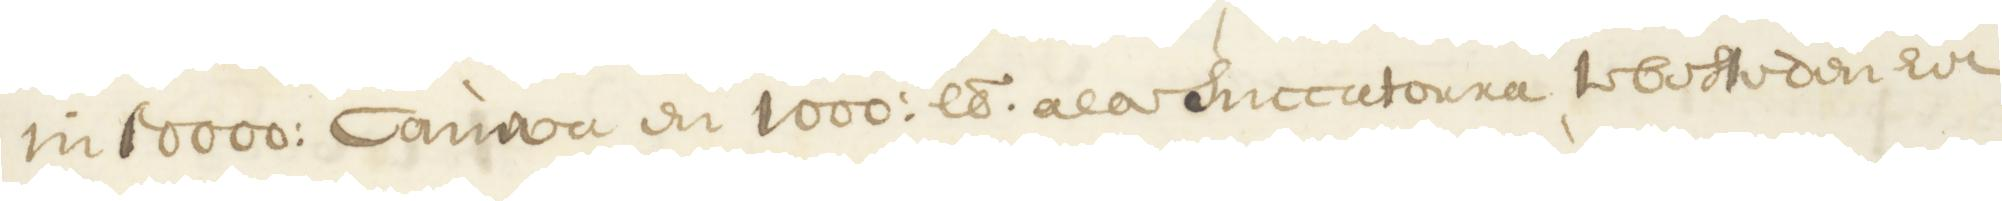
in 50000: Cauwa en 1000: lb. aloe succatorra tebesteden het
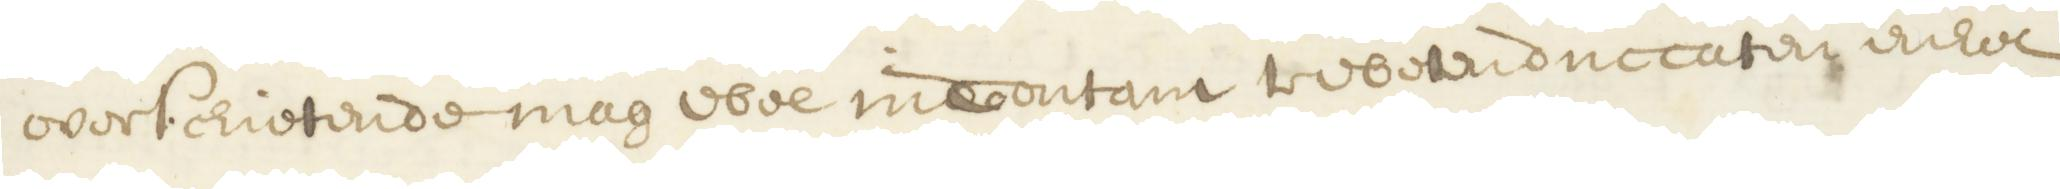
overschietende mag wel incontant teweten duccaten enhet
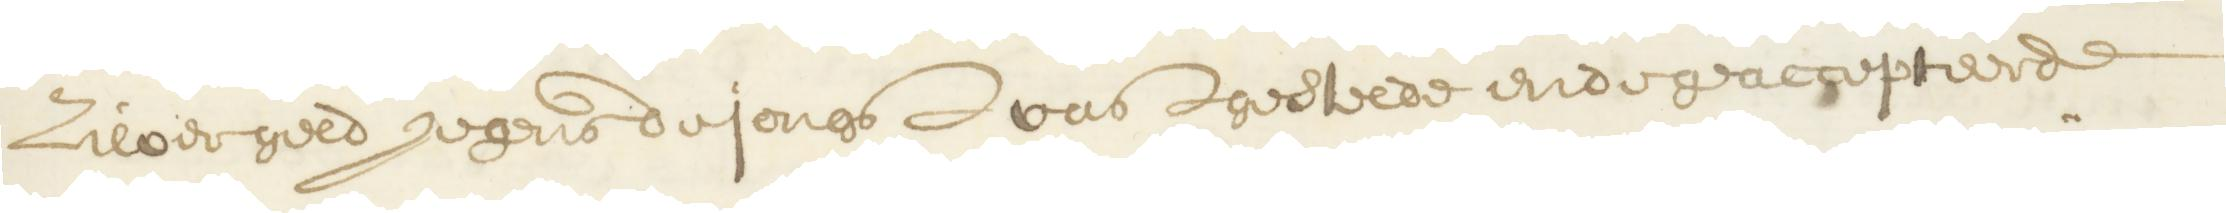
zilvergeld Jegens de jongst vastgestelde ende geaccepteerde
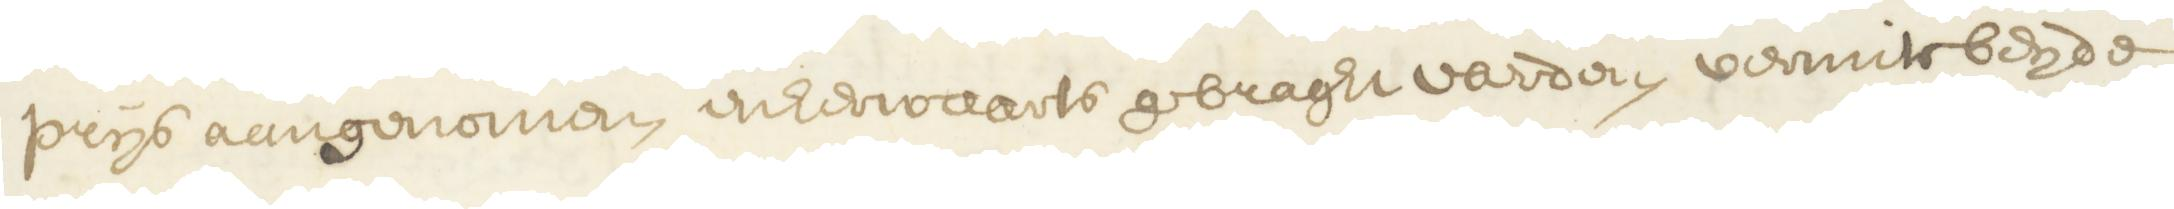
prijs aangenomen, en herwaarts gebraght voerden, vermits beijde
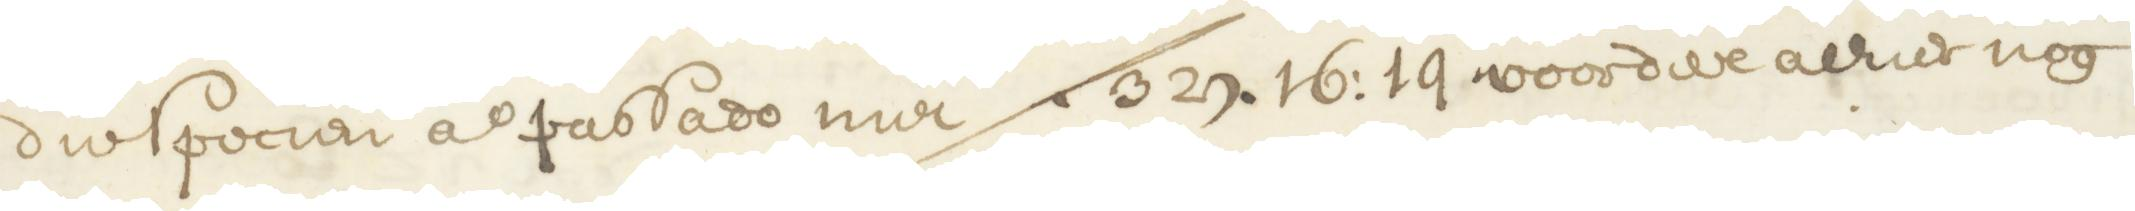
die specien ao passado met ƒ327. 16: 14 voordeel alhier nog
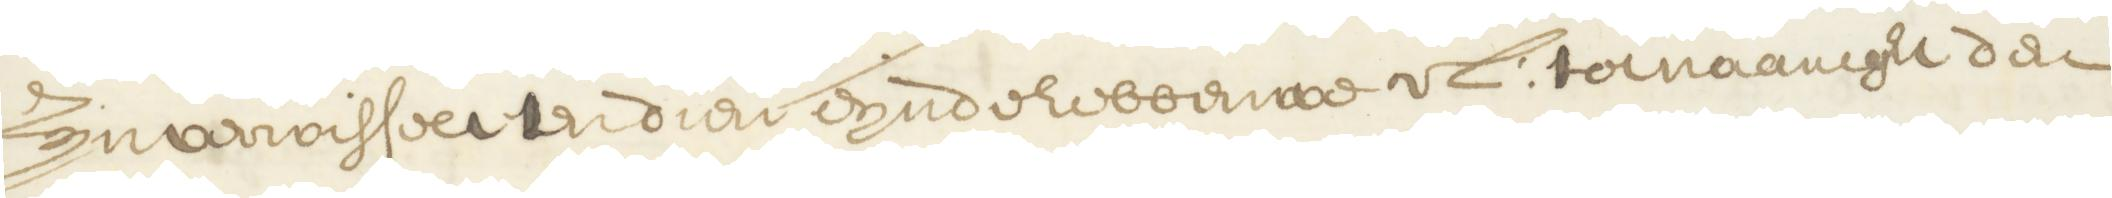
zijn verwisselt ten dien eijnde hebbenwe vL: tot naaright den
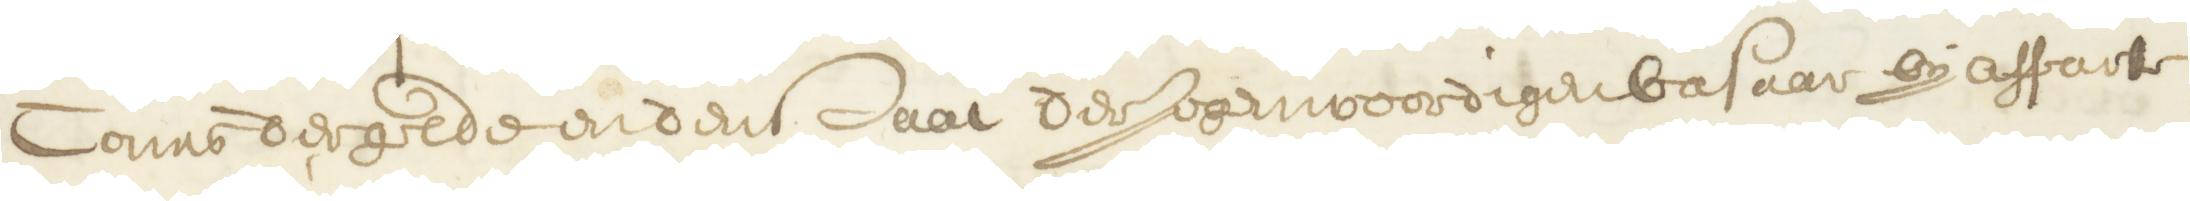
Cours dergelde en denstaat der Jegenwoordigen basaar bij apparte
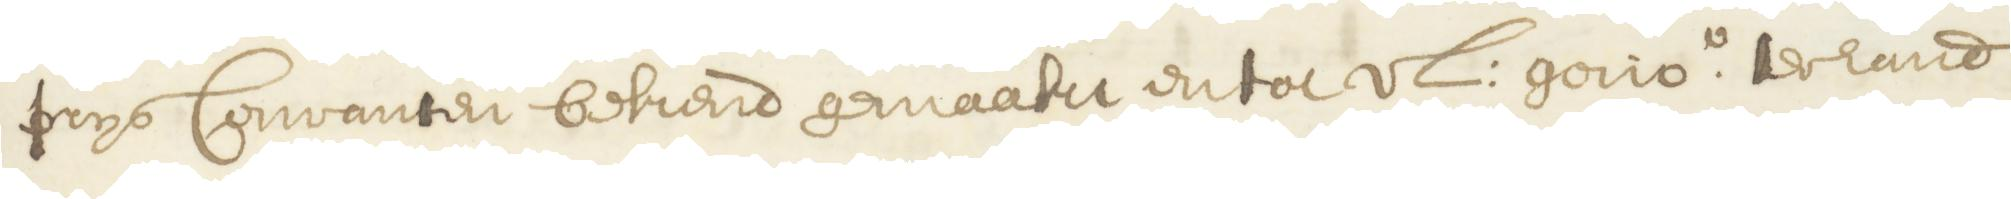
prijs Couranten bekend gemaakt en tot vL: gouv.r ter hand
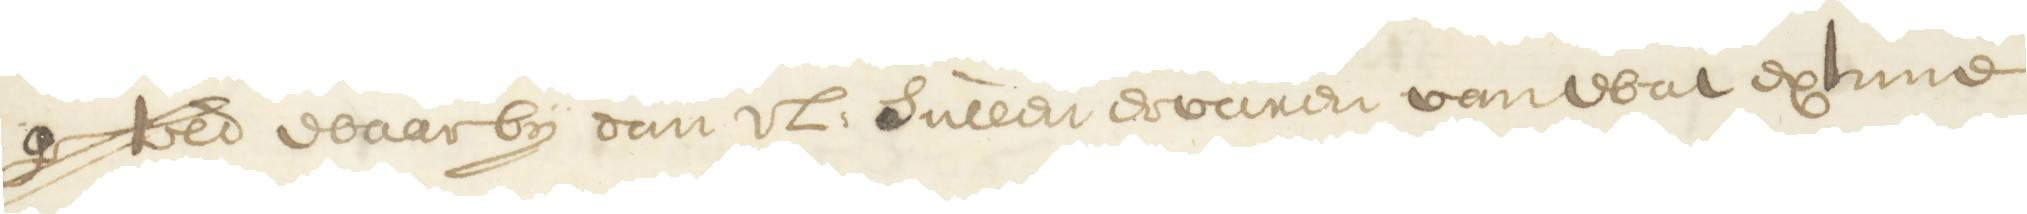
gesteld waarbij dan vl: sullen ervaren van wat extime
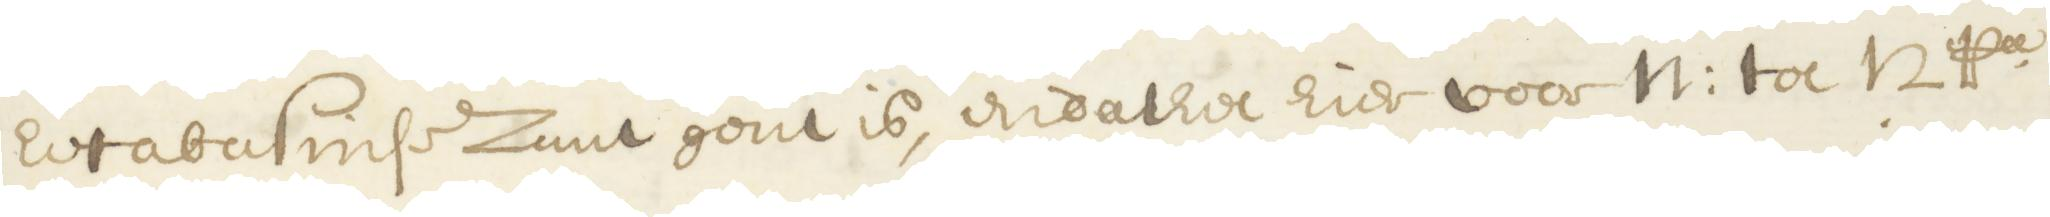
het abasinse zmit gout is, endathet hier voor 11: tot 12 R=a
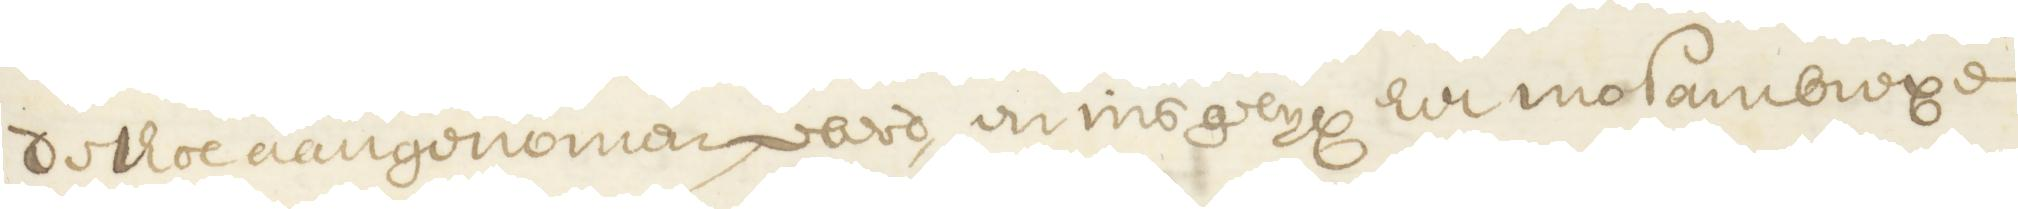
de thol aangenomen werd, en insgelijx het mosambiexe
